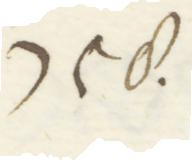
758.
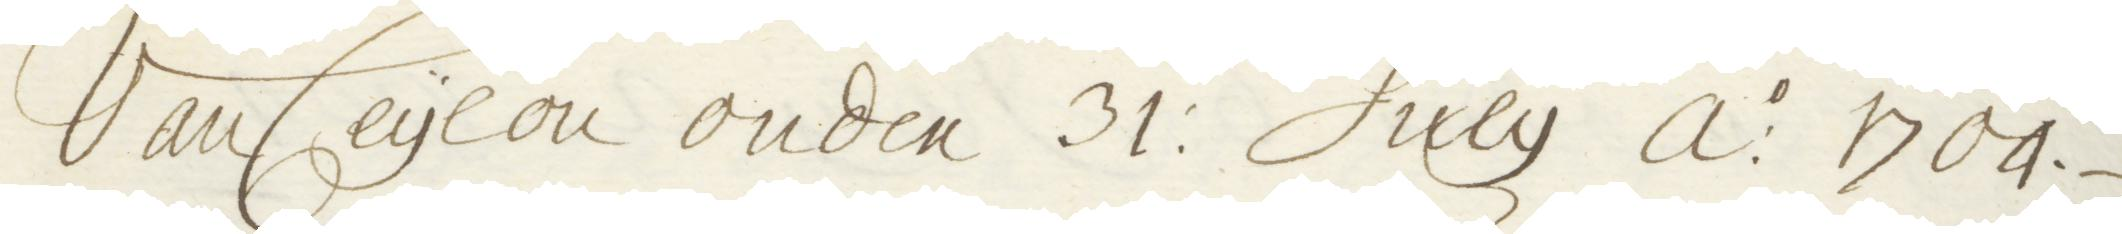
Van Ceijlon onder 31: Julij a:o 1704.—
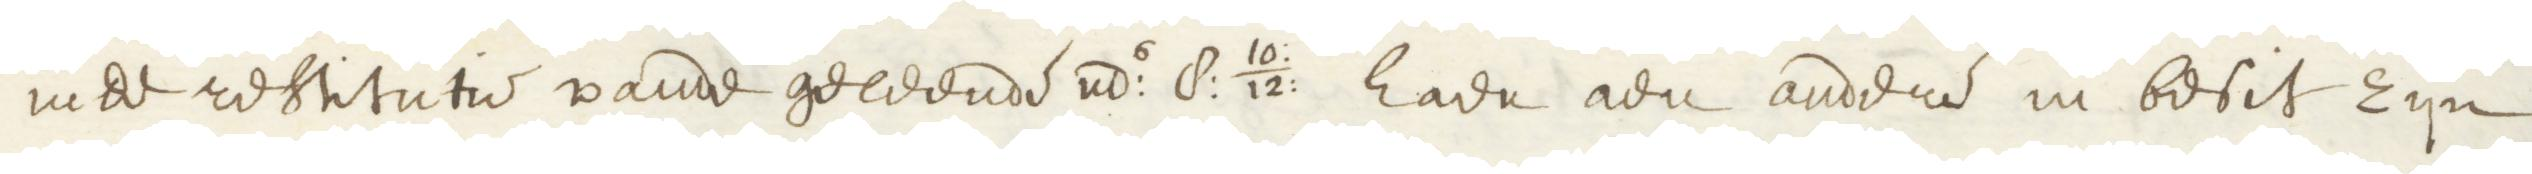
in de restitutie vande geleende rd:s 8: 10:/12: haer aen andere in besit zijn
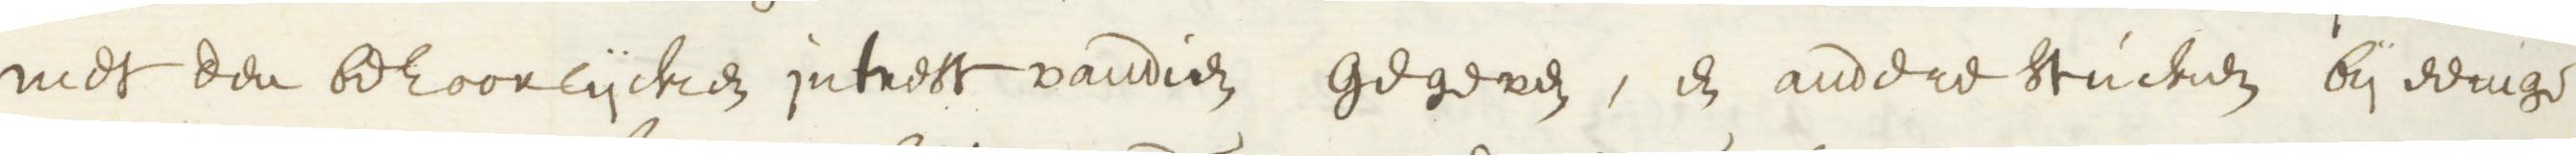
met den behoorlijcken intress vandien gegeven, en andere stucken bij eenige
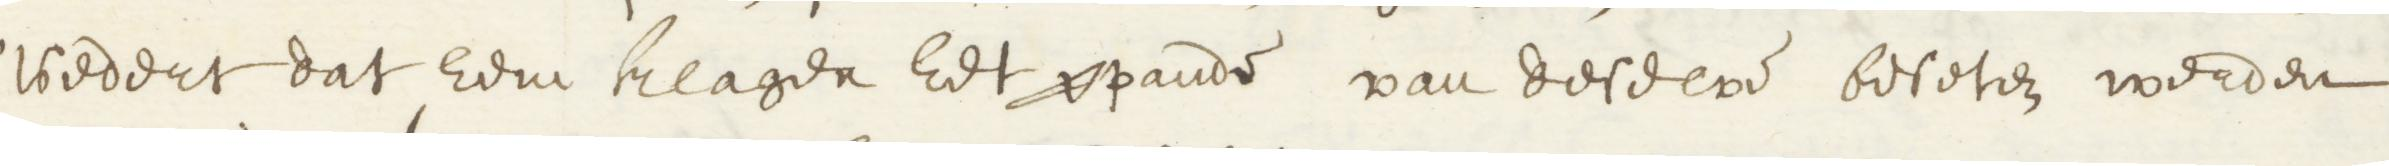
'tsedert dat hem klager het verpande van deselve beseten werden
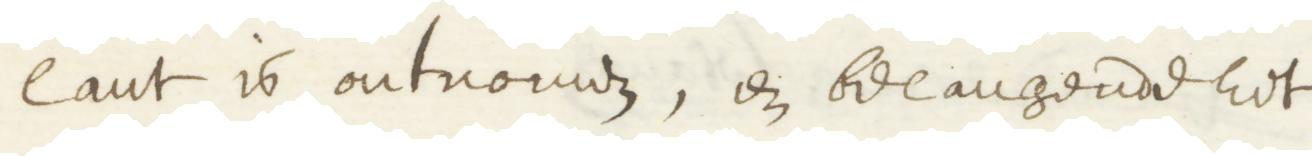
lant is ontnomen, en belangende het
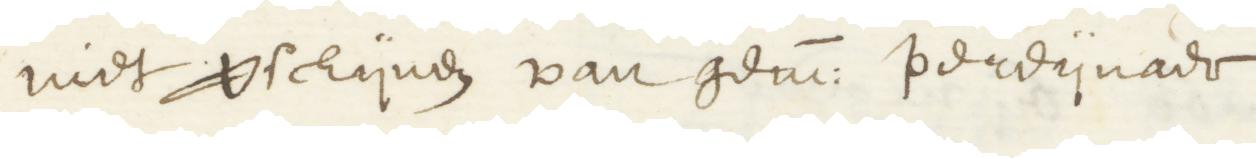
niet verschijnen van gem: pereijnaer
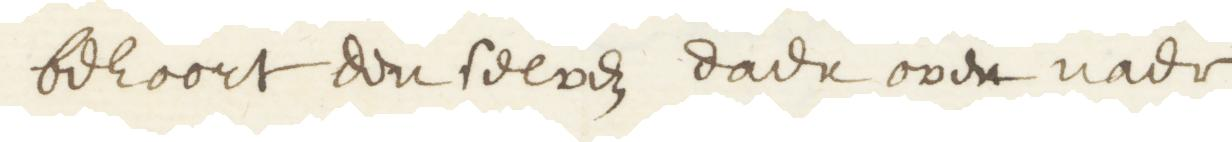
behoort den selven daer over naer
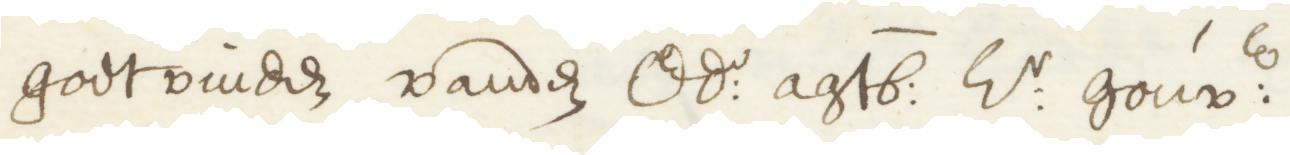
goetvinden vanden Ed: agtb: h:r gouv:'
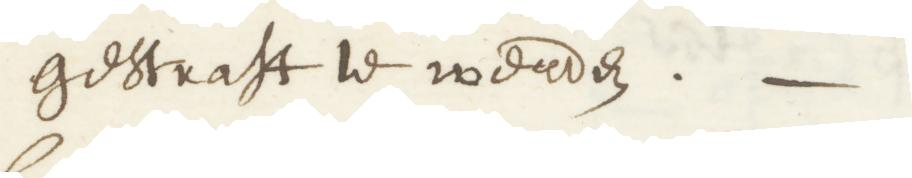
gestraft te werden. —
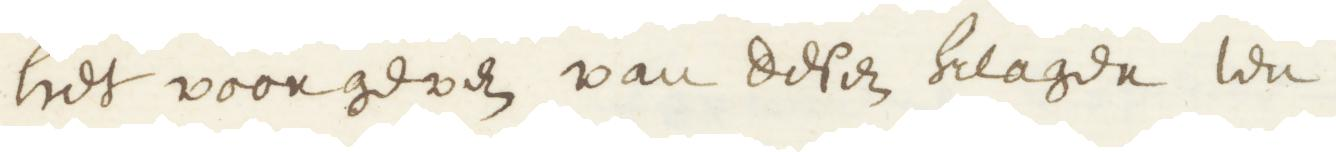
het voorgeven van desen klager ten
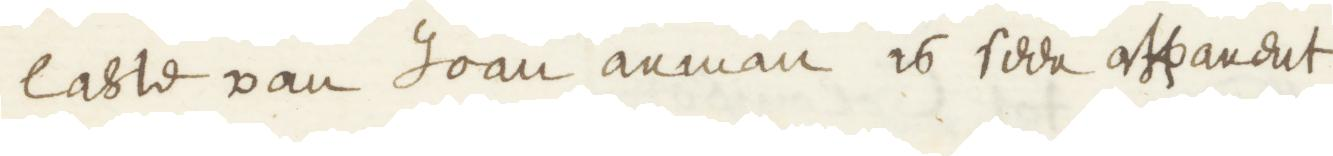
laste van Ioan arman is seer apparent
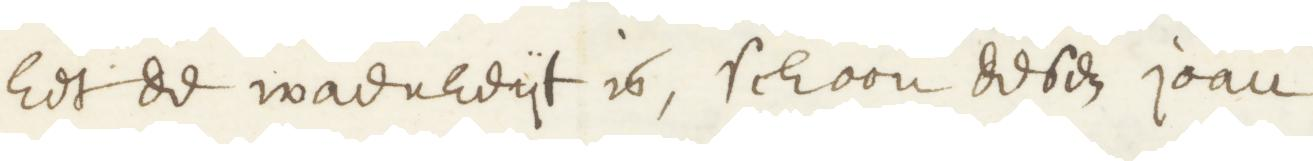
het de waerheijt is, schoon desen joan
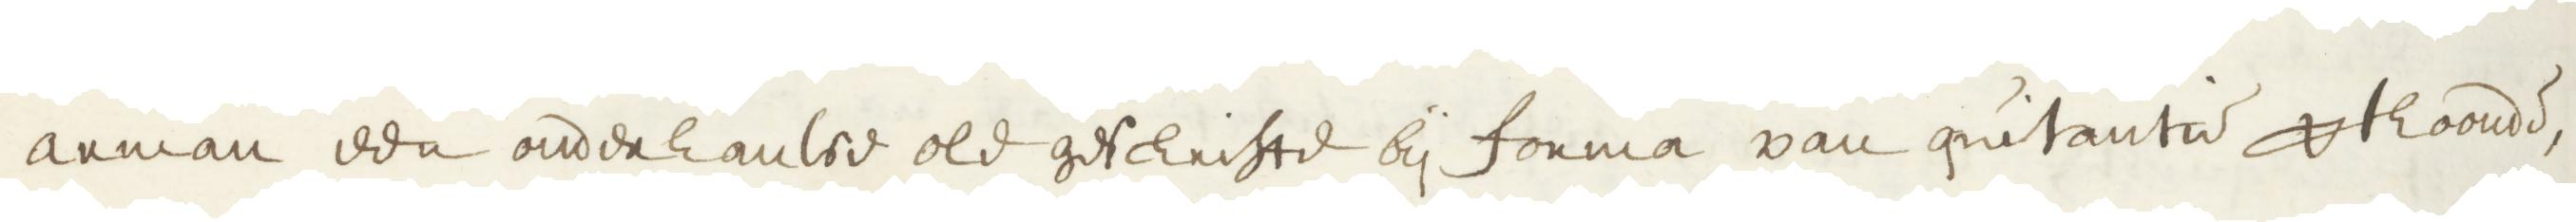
arman een onderhantse ole geschrifte bij forma van quitantie verthoonde,
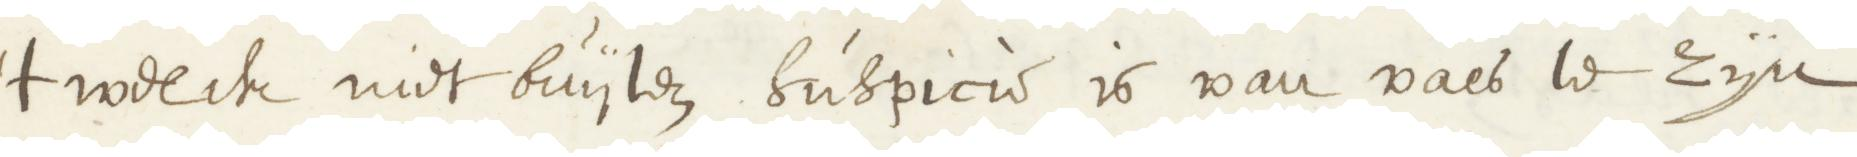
’t welck niet buijten suspicie is van vals te zijn
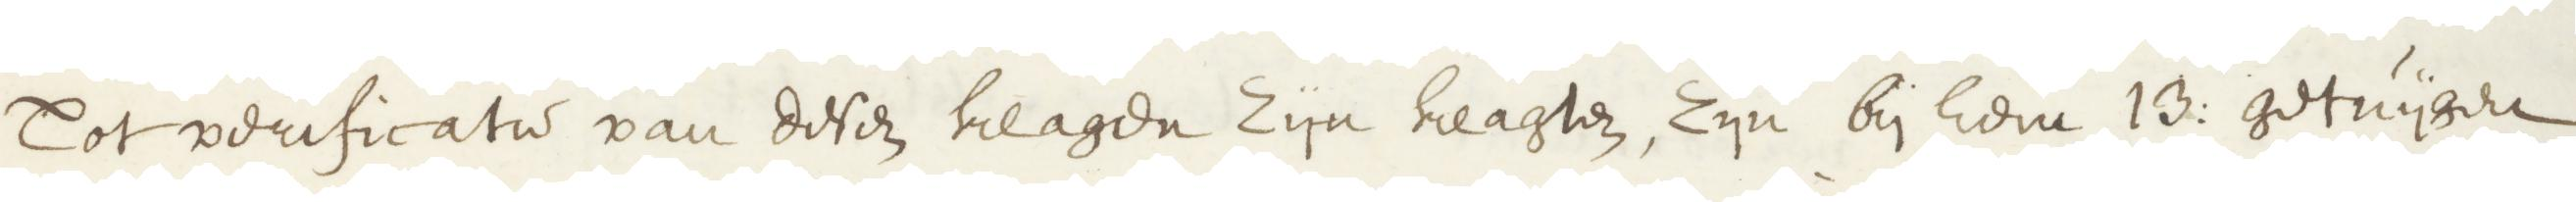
Tot verificatie van desen klager zijn klagten, zijn bij hem 13: getuijgen
